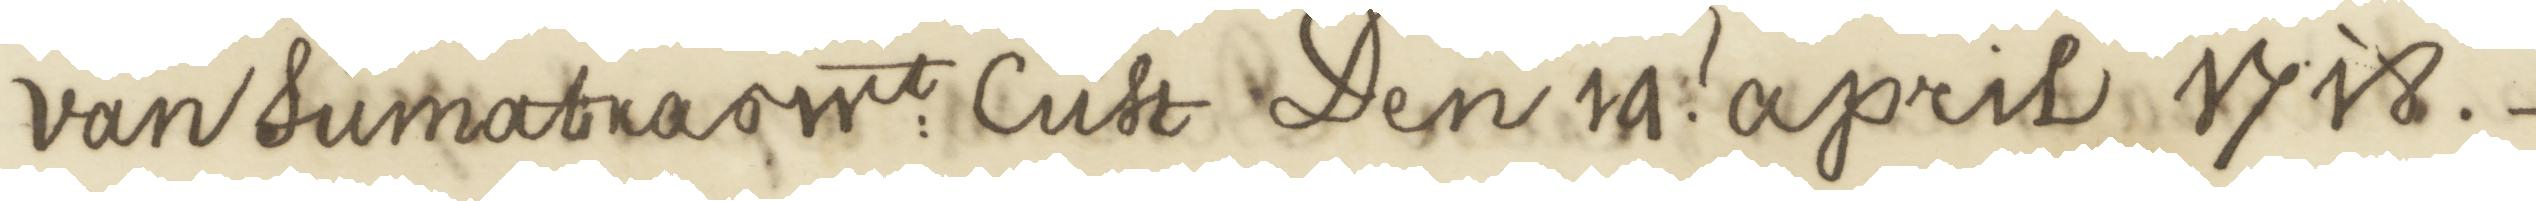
van Sumatras w:t Cust Den 14.' april 1718.
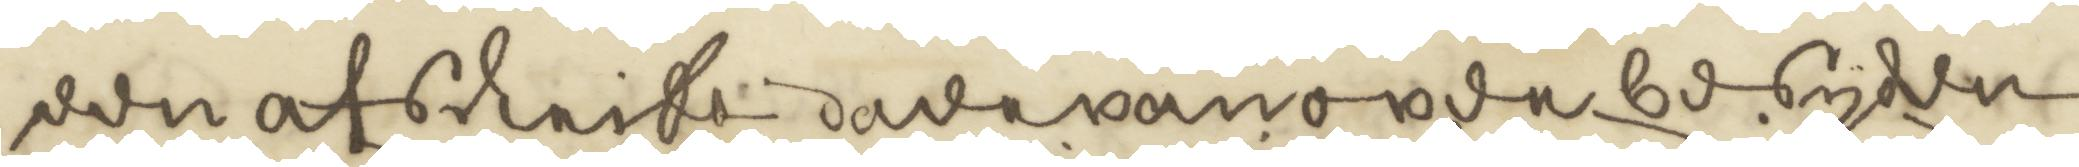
een afschrift daer van over besijden
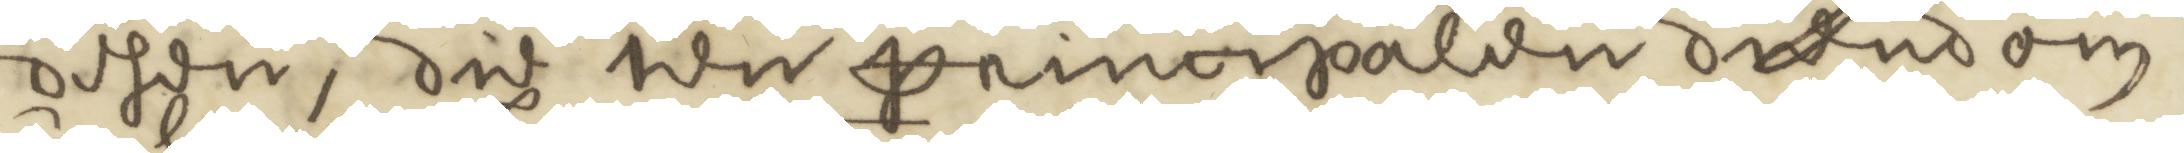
desen, die ten principalen diend om
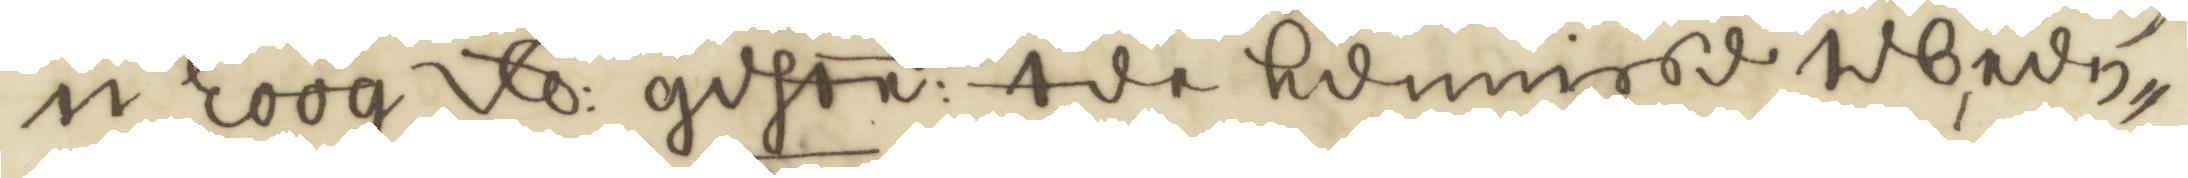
u hoog Ed: gestr: ter kennise te bren„
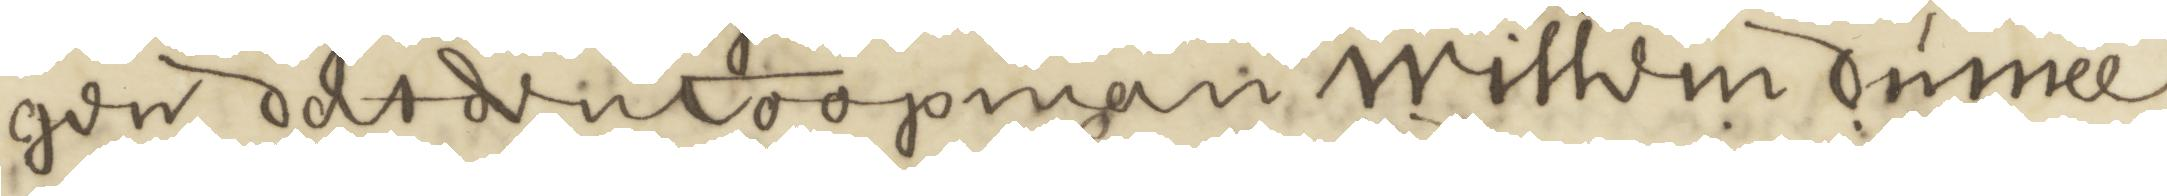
gen dat den Coopman Willem dumee
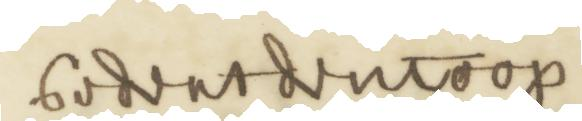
sedert den coop
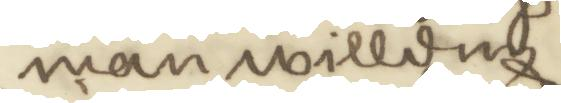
man willem
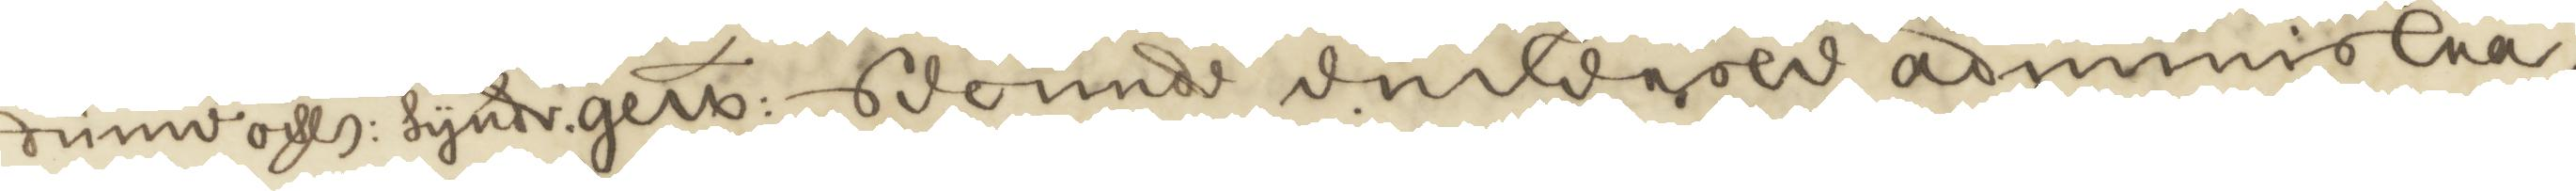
dume overl: sijnde. gew: secunde en Eerste administra
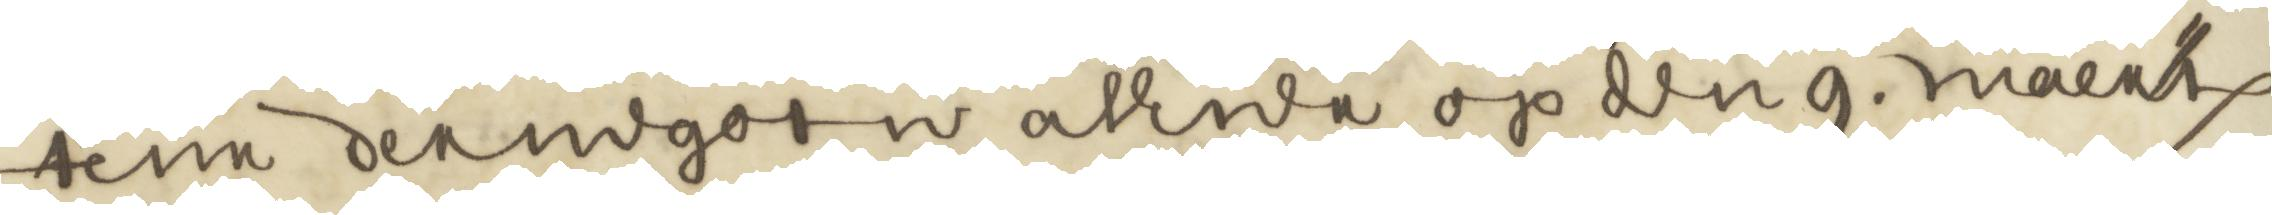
teur der negotie alhier op den 9. maert
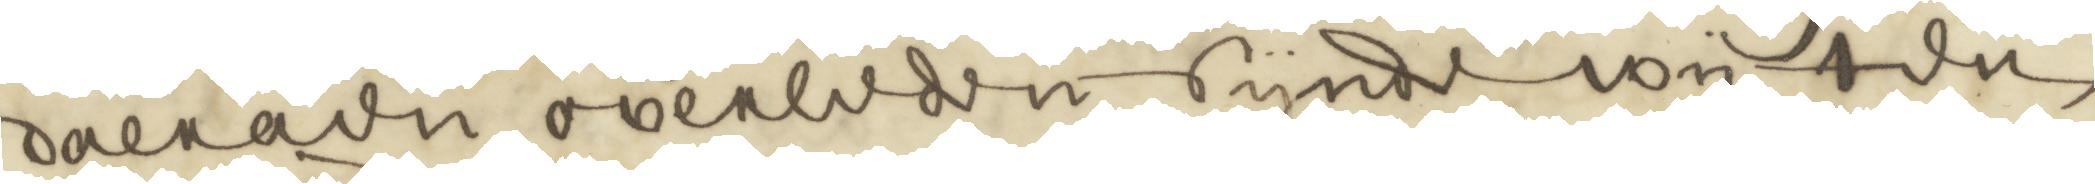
daer aen overleden sijnde wij ten
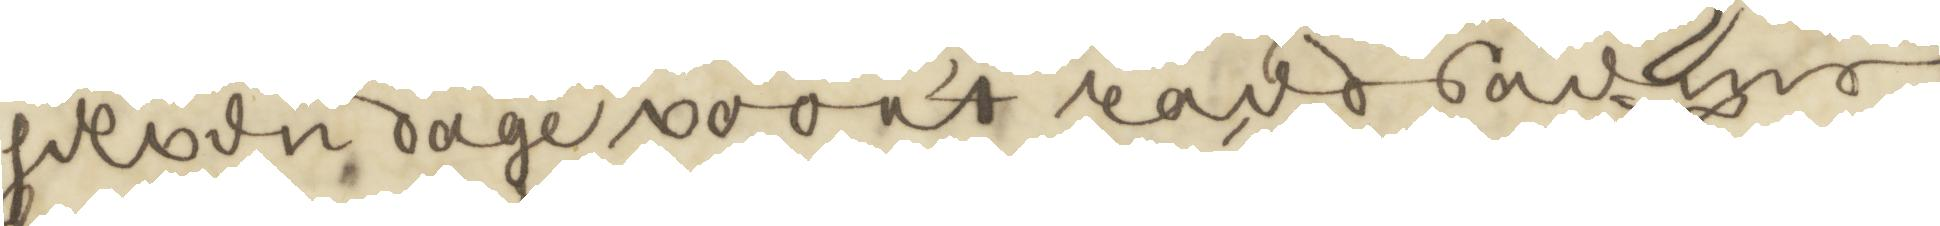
selven dage voor ’t raedsaems
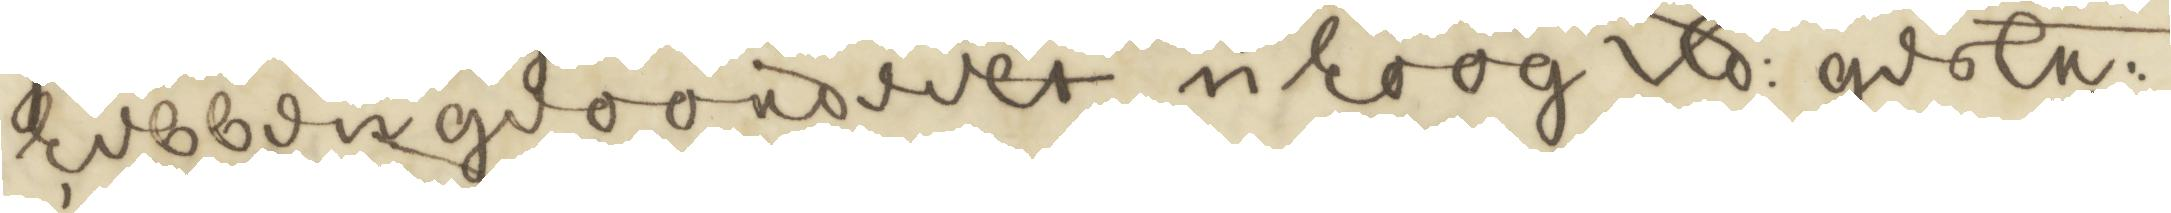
hebben geoordeelt u hoog Ed: gestr:
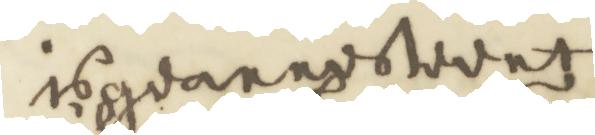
is gearresteert
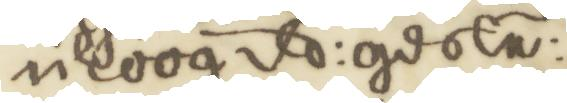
u hoog Ed: gestr:
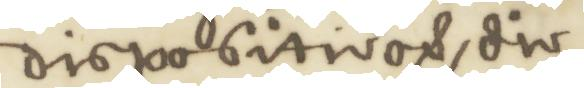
dispositie over, die
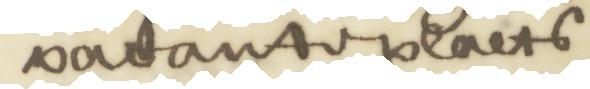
vacante plaets
